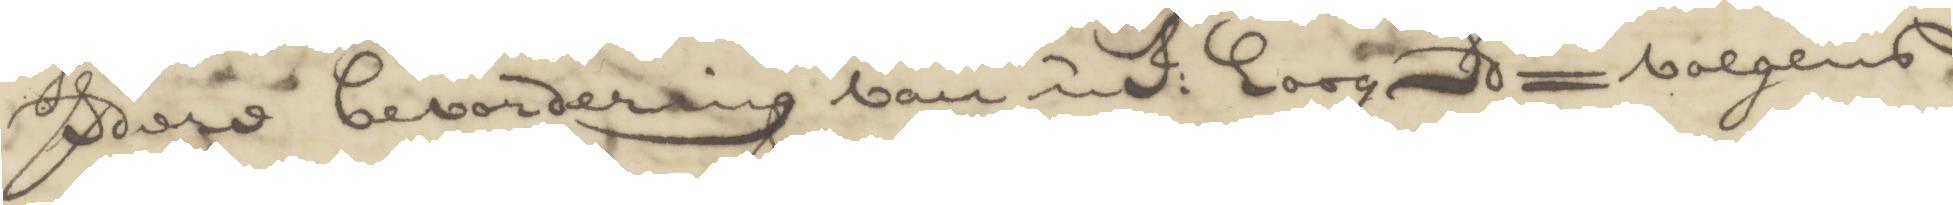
verdere bevordering van uE: hoog Ed=s volgens
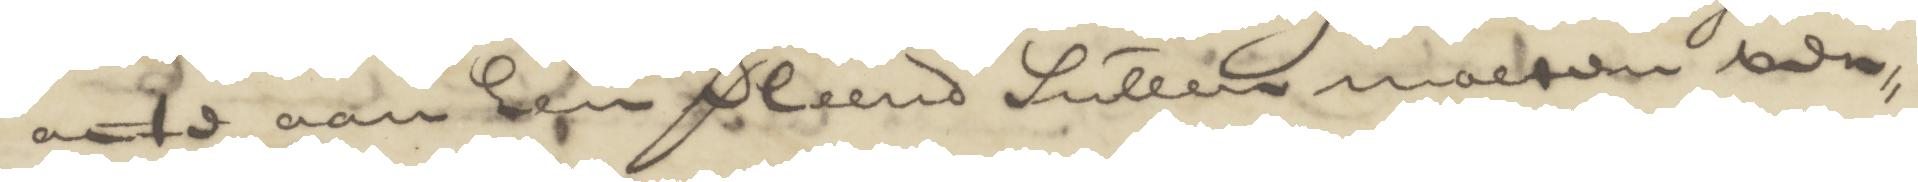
acte aan hen verleend sullen moeten ver„
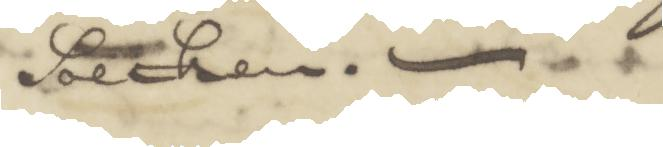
soecken. —
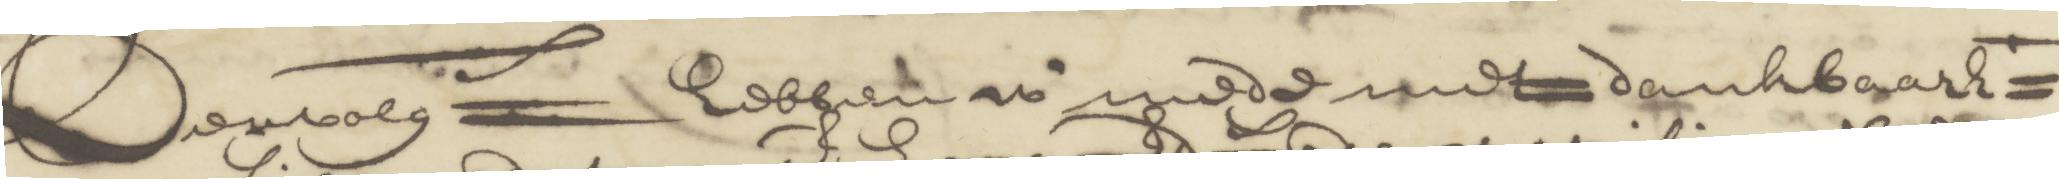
Vervolg=s hebben w' mede met dankbaarh=t
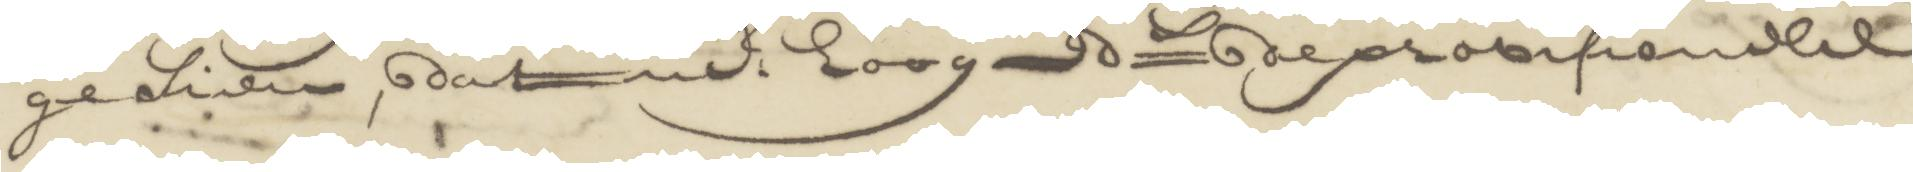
gesien, dat uE: hoog Ed=s de provisionele
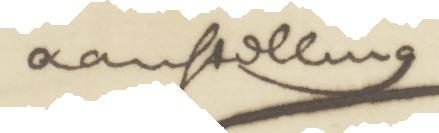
aanstelling
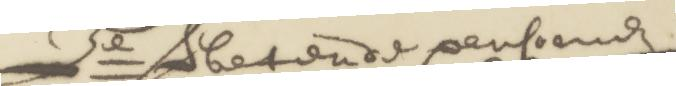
P=e verbeterde persoenen
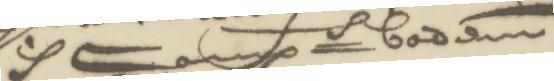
op 's Comp=s bodem
